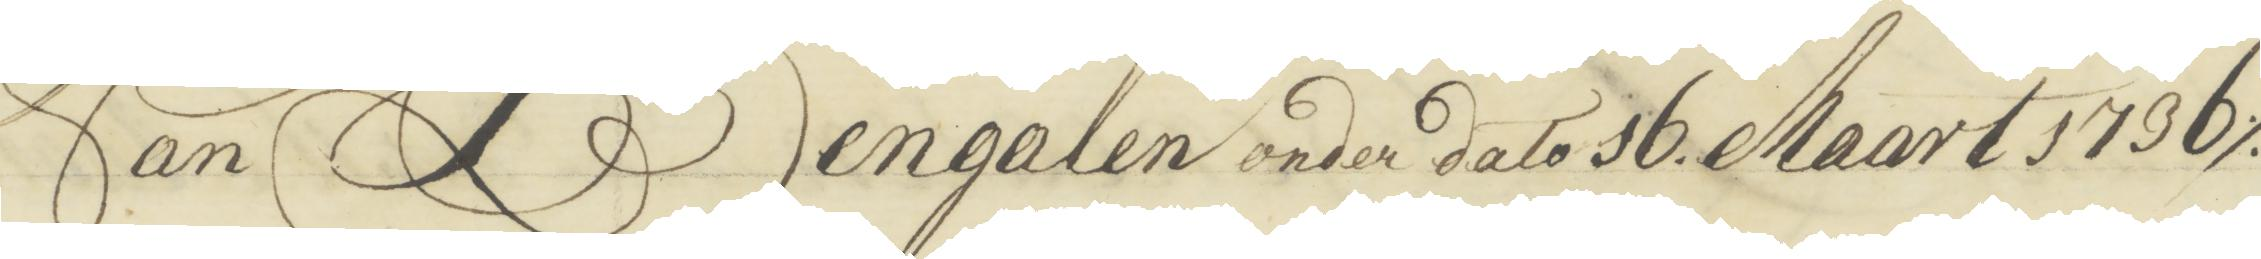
Van Bengalen onder dato 16. Maart 1736
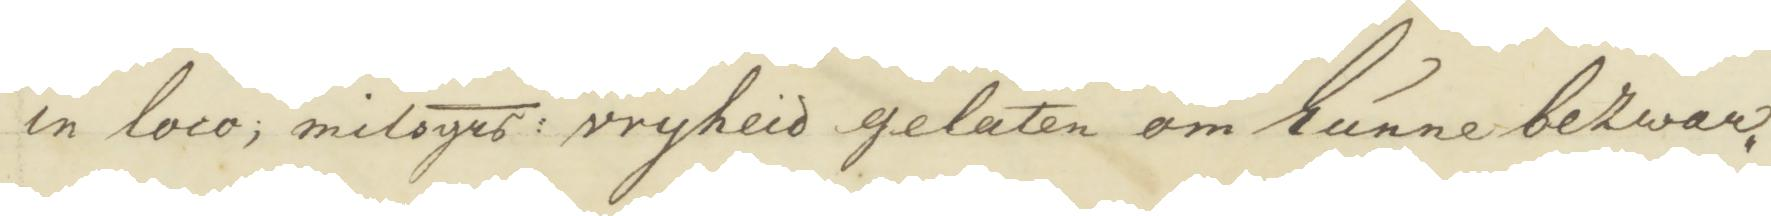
in loco; mitsgrs: vryheid gelaten om hunne bezwar„
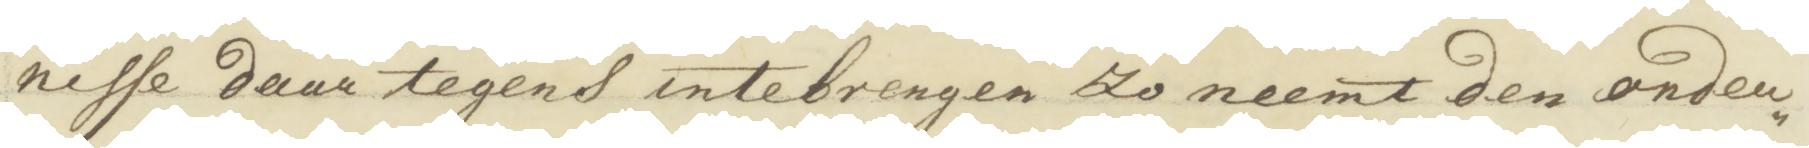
nisse daar tegens in te brengen zo neemt den onder„
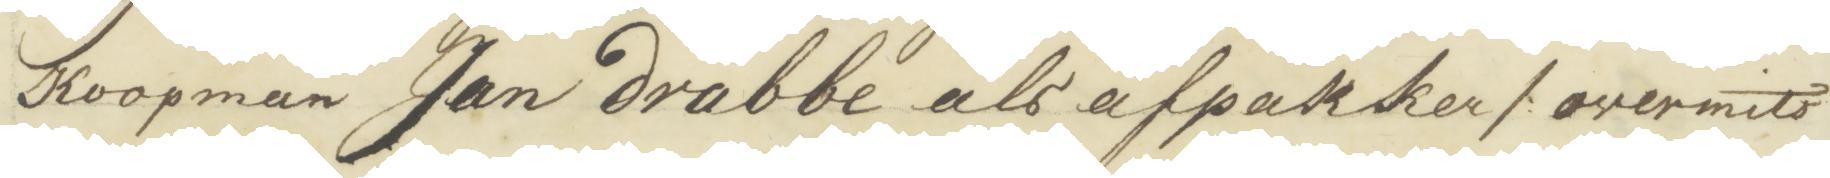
koopman Jan drabbe als afpakker /: overmits
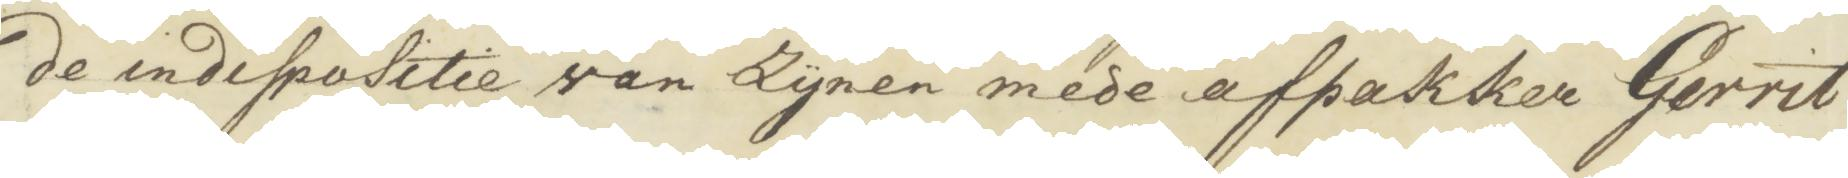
de indispositie van zijnen mede afpakker Gerrit
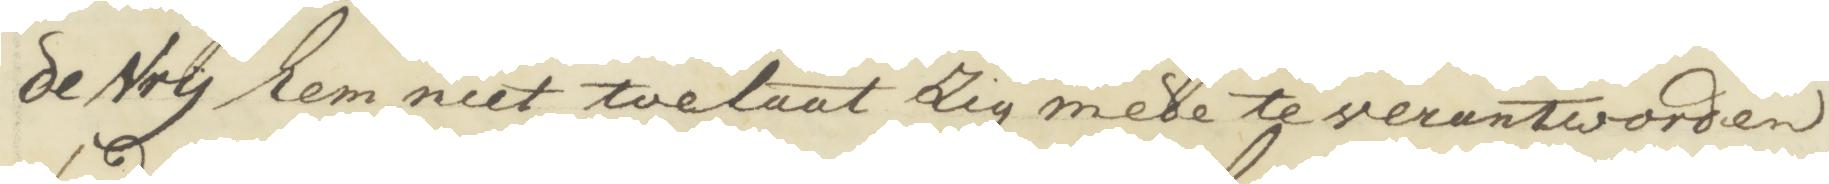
de Vrij hem niet toelaat zig mede te verantworden
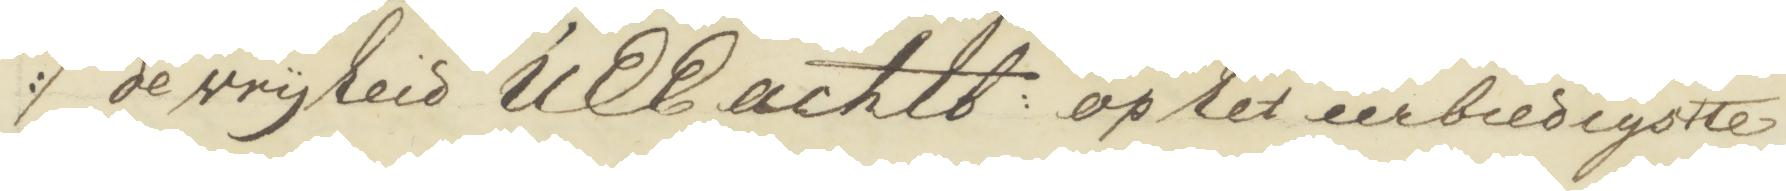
:/ de vrijheid UEE achtb: op het eerbiedigste
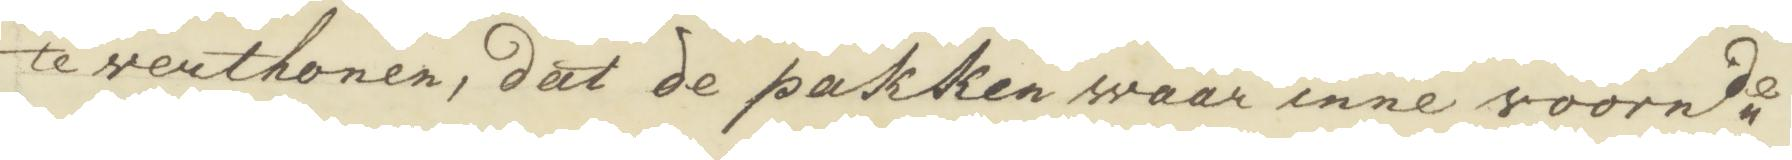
te verthonen, dat de pakken waar inne voorn„de
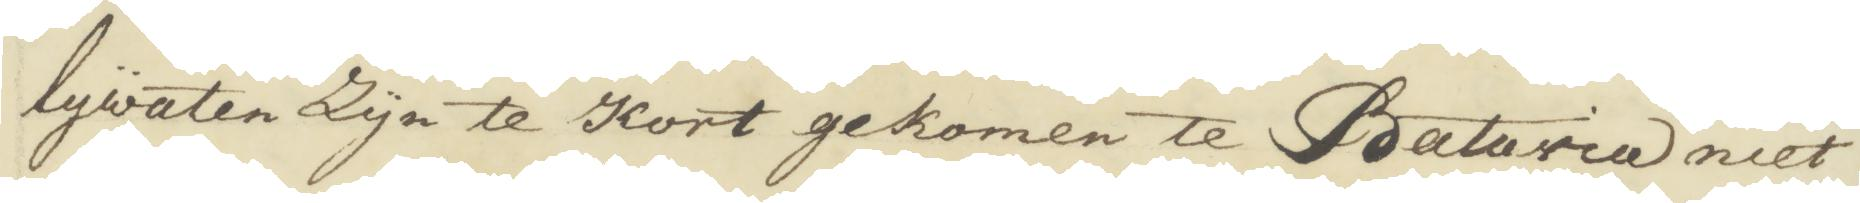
lijwaten zijn te kort gekomen te Batavia niet
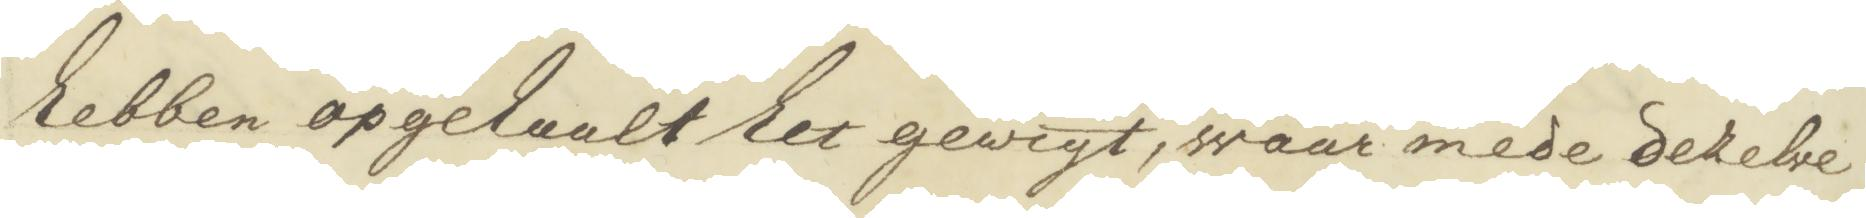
hebben opgehaalt het gewigt, waar mede dezelve
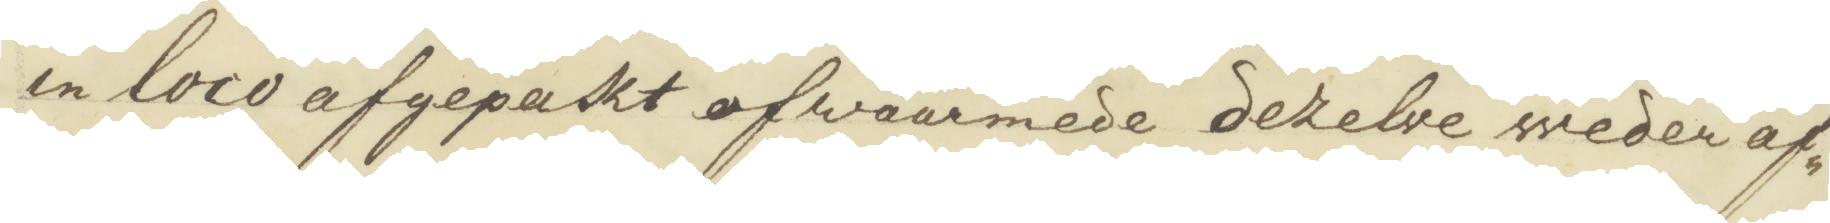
in loco afgepakt of waarmede dezelve weder af„
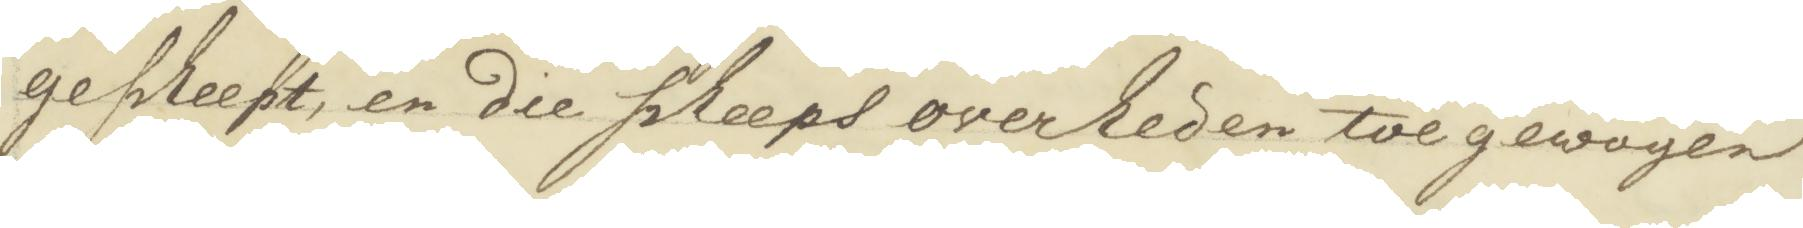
gescheept, en die scheeps overheden toe gewogen
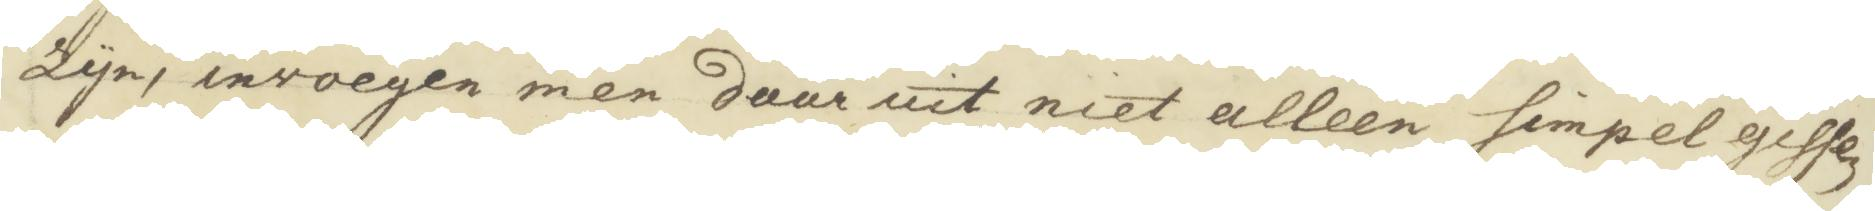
zijn, invoegen men daar uit niet alleen simpel gissen
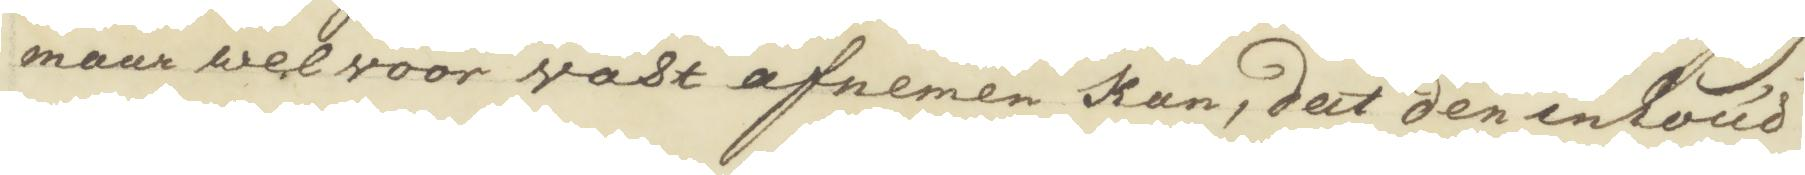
maar wel voor vast afnemen kan, dat den inhoud
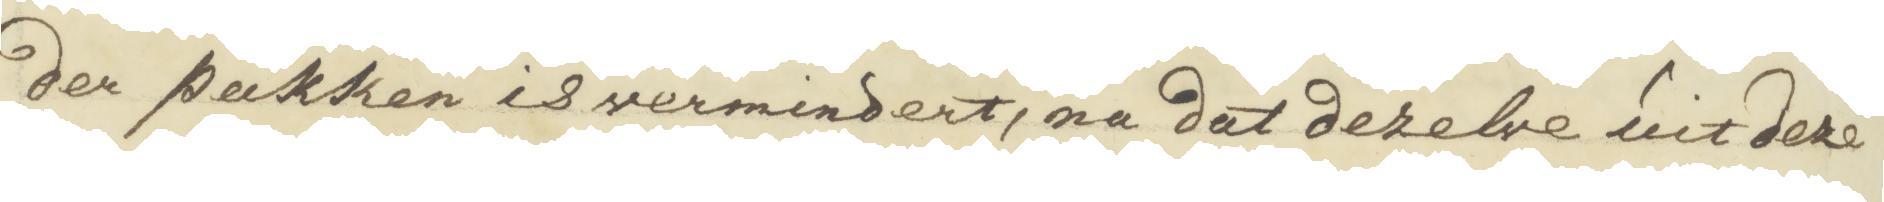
der pakken is vermindert, na dat dezelve uit deze
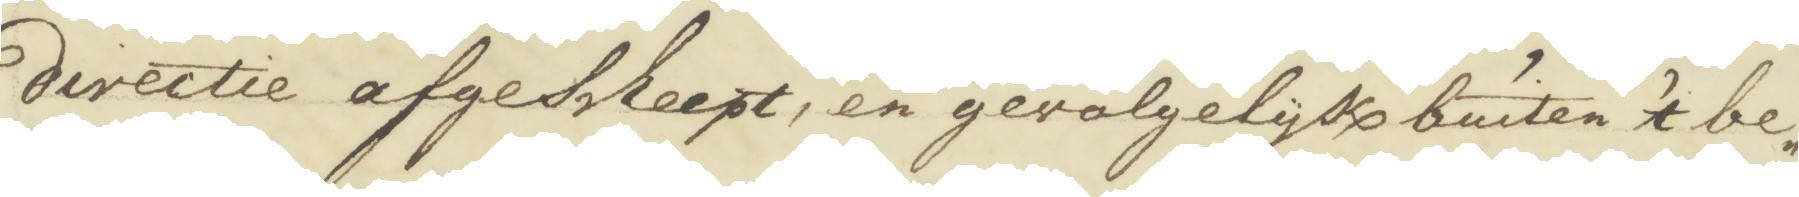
directie afgescheept, en gevolgelijk buiten ’t be
